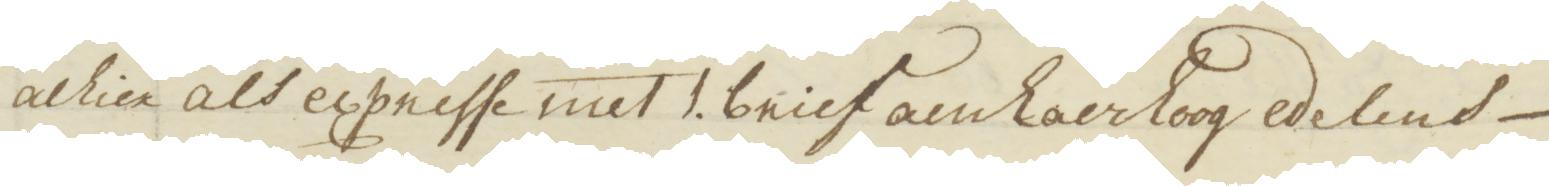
alhier als expresse met 1. brief aen haer hoog edelens —
